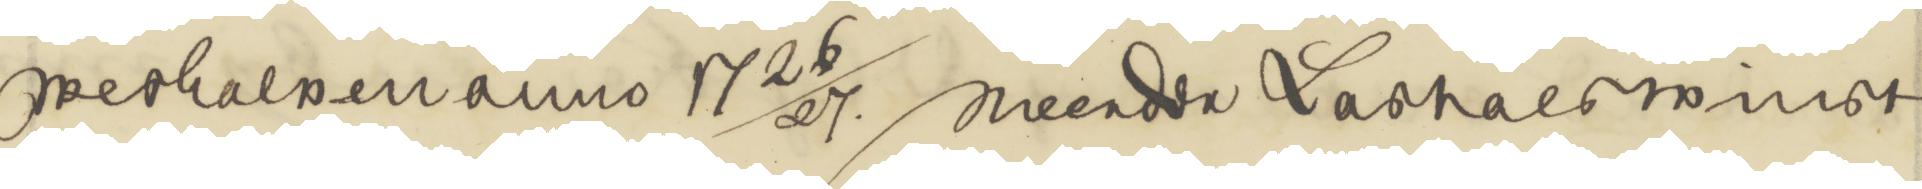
weshalven anno 17 26/27. meerder last als winst . . . ƒ10929. 5. 8.
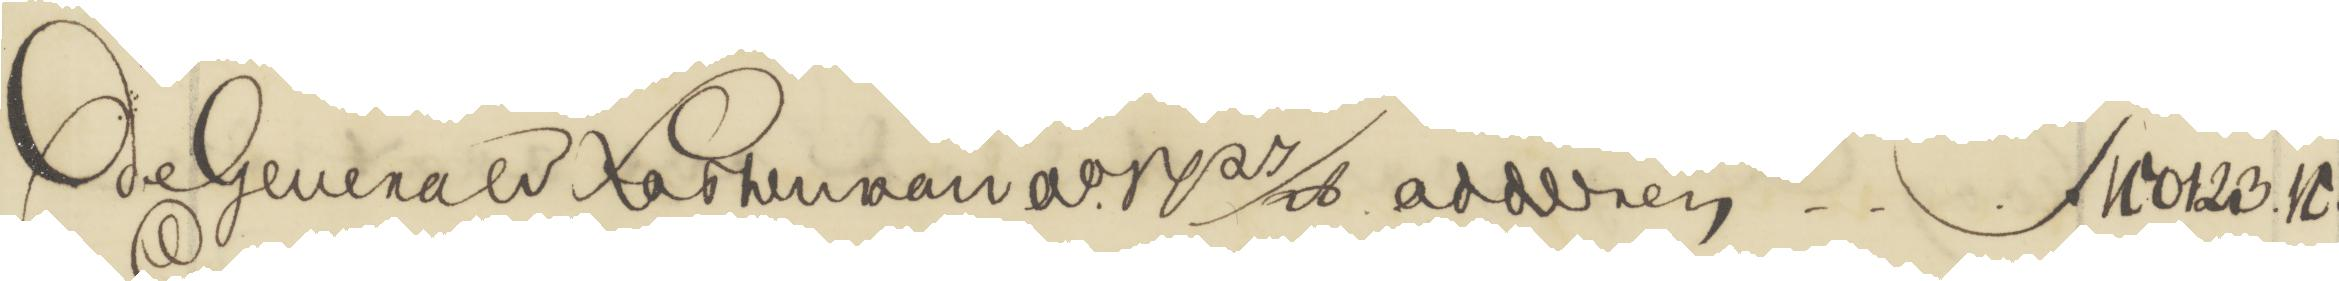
de Generale Lasten van a:o 17 27/28. addeeren . . . ƒ150123. 15. 8.
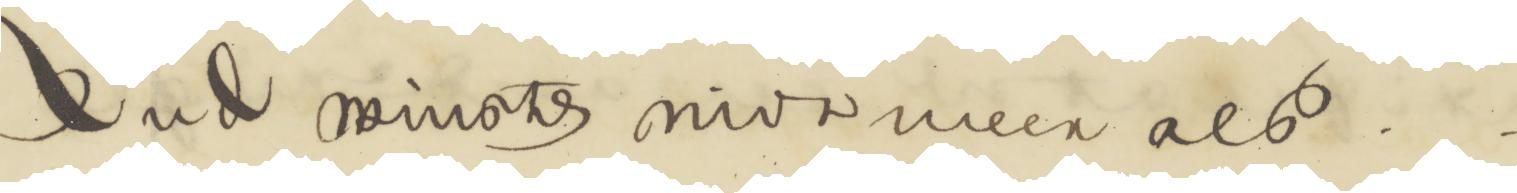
Ende winsten niet meer als . . . . . . „ 77883. 13. 8.
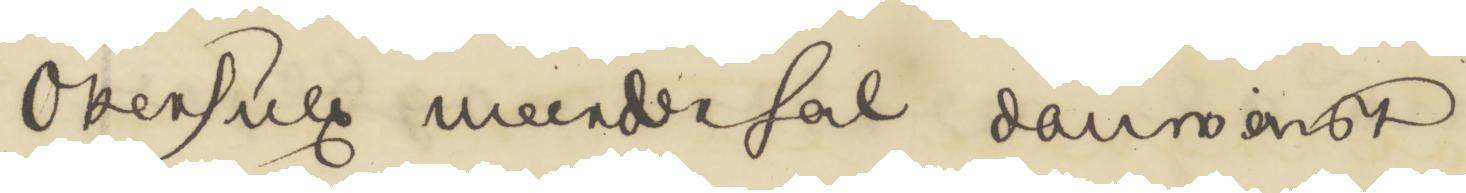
oversulx meerder sal dan winst . . . . . . . „ 72240. 2 –
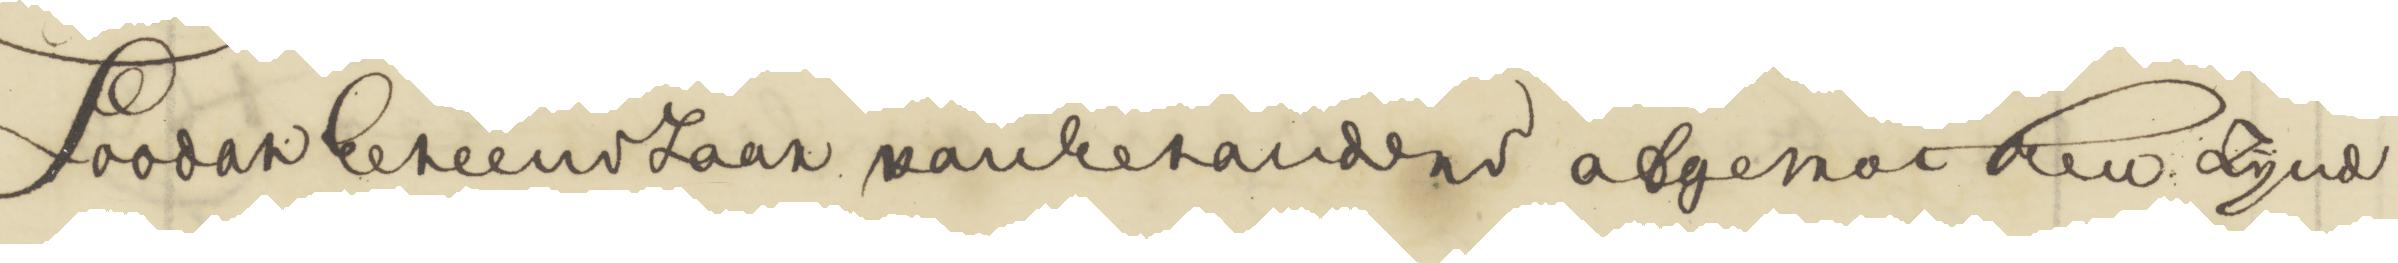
Soodat het eene Jaar van het andere afgetrocken zijnde
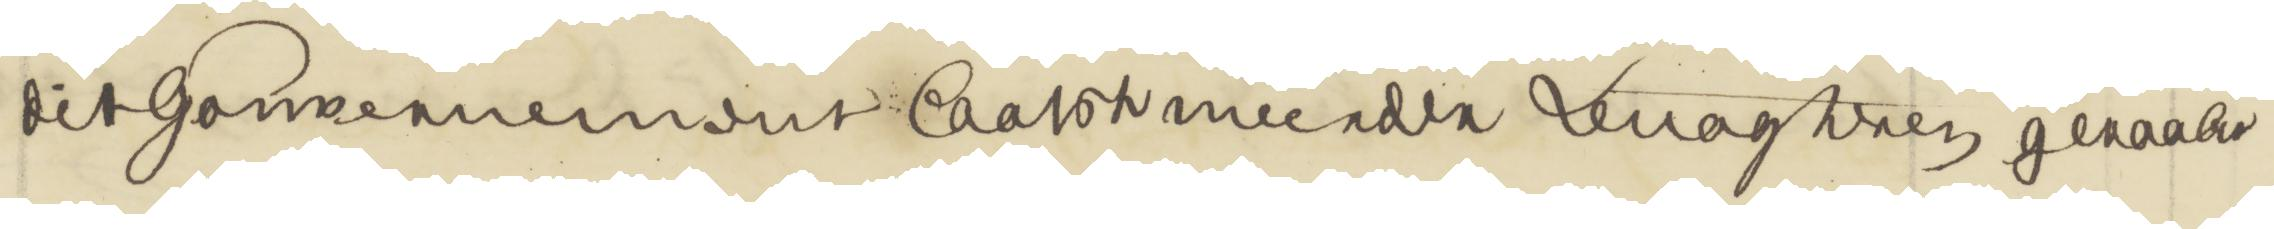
dit gouvernement laatst meerder ten agteren geraakt
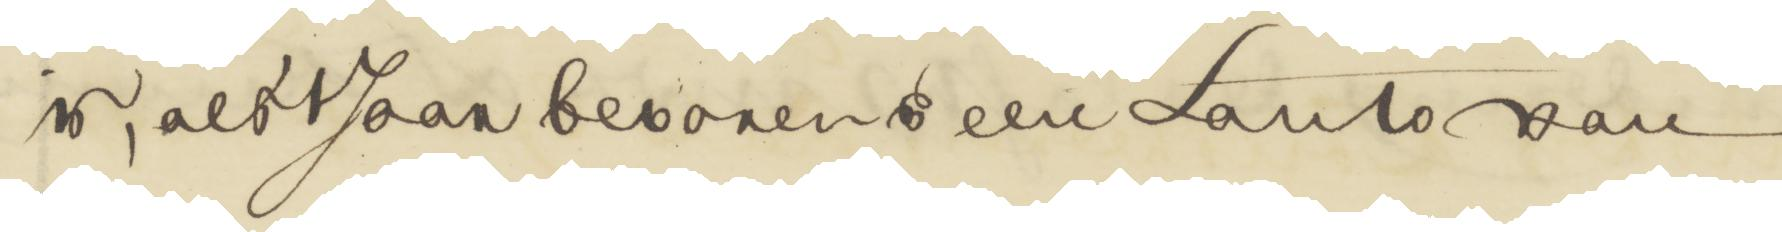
is, als tJaar bevorens een tanto van . . . . . ƒ61310:16: 8
